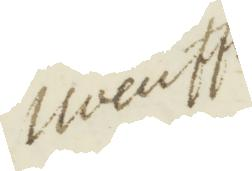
Hoeufft
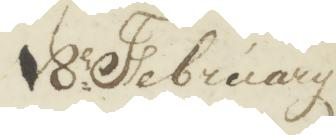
18=en February
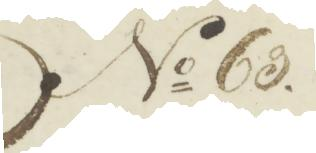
N=o 63.
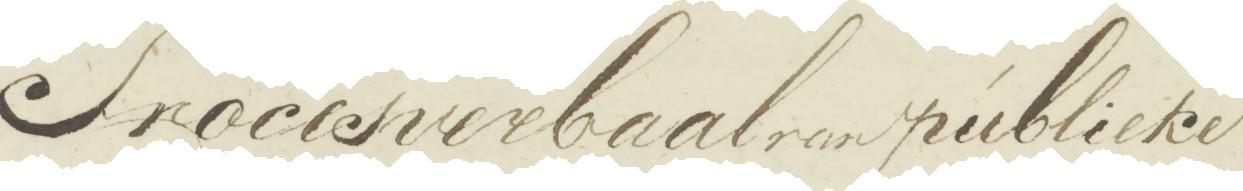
Procesverbaal van publieke
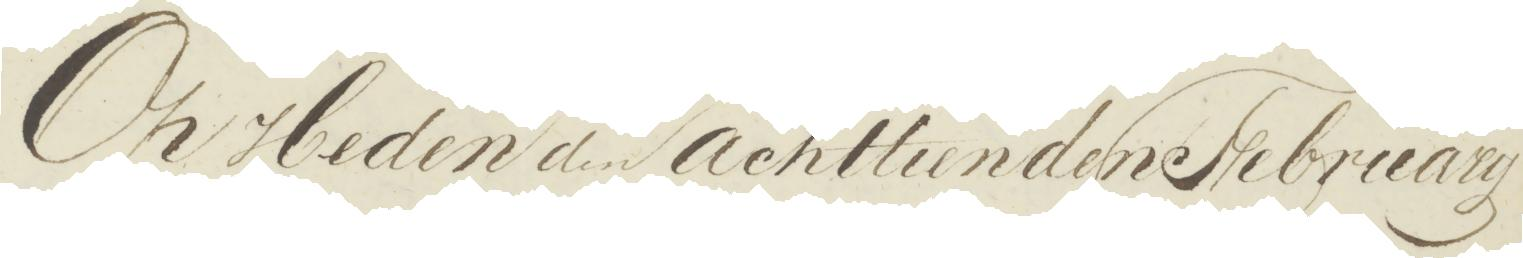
Op Heden den achttienden February
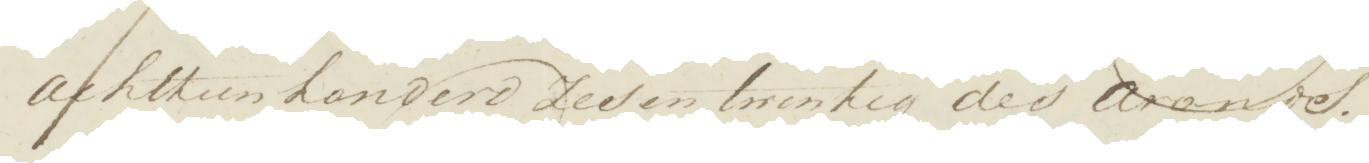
achttien honderd zes en twintig des avonds.
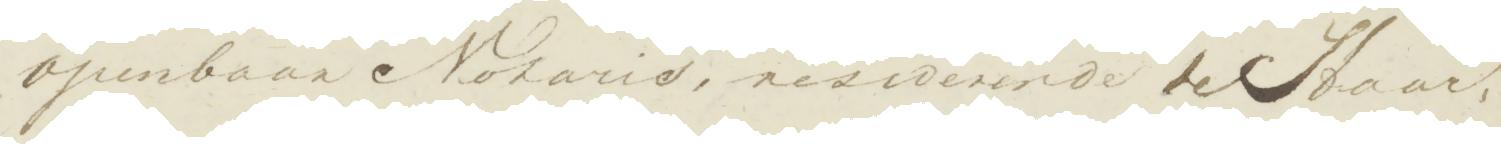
openbaar Notaris, residerende te Haar,
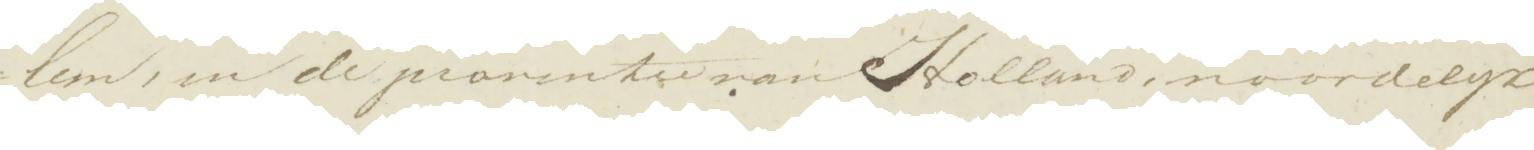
=lem, in de provintie van Holland, noordelyk
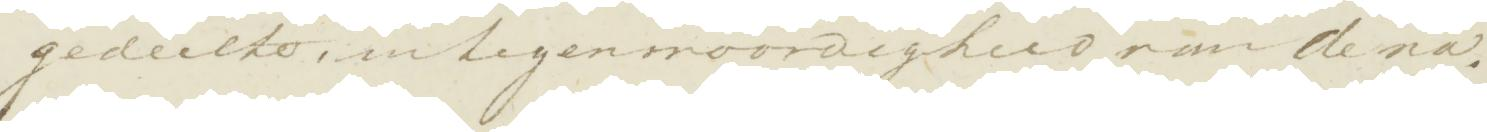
gedeelte, in tegenwoordigheid van de na,
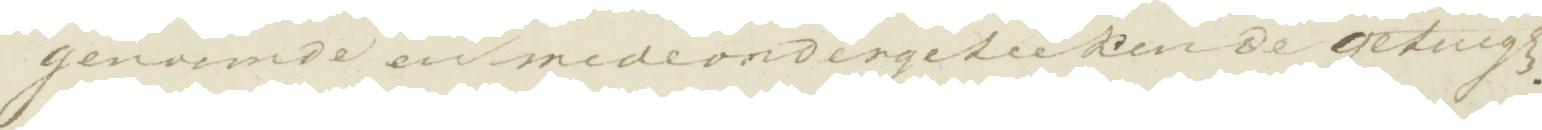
genoemde en mede ondergeteekende getuigen.
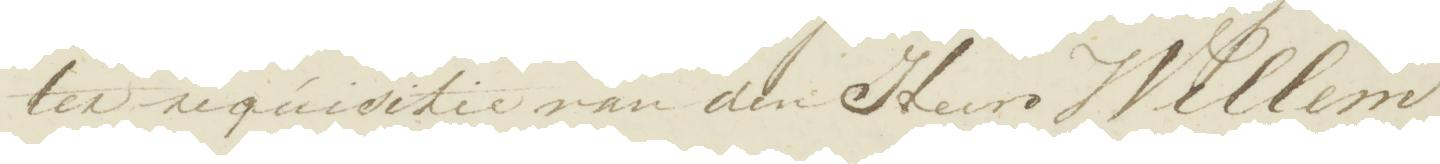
ter requisitie van den Heer Willem
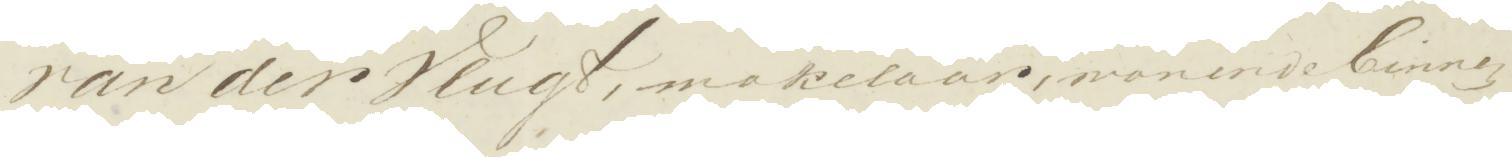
van der Vlugt, makelaar, wonende binnen
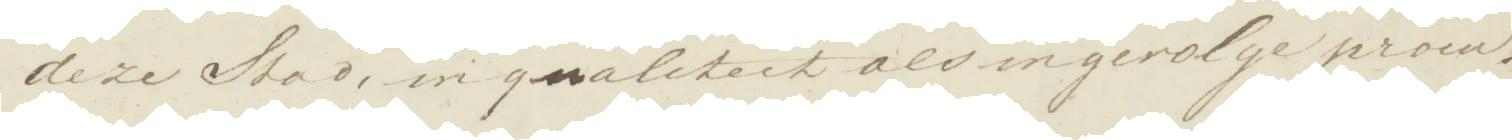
deze Stad, in qualiteit als ingevolge procu,
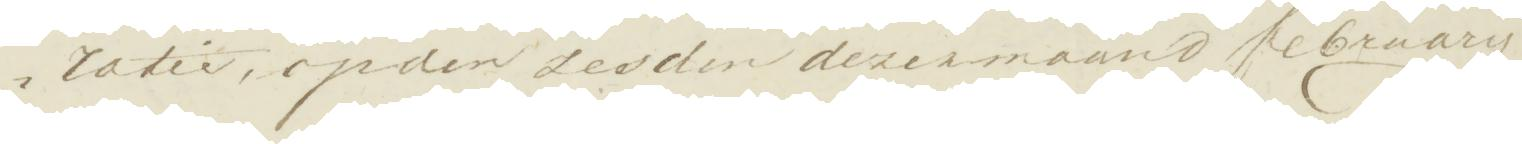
„ratie, op den zesden dezer maand february
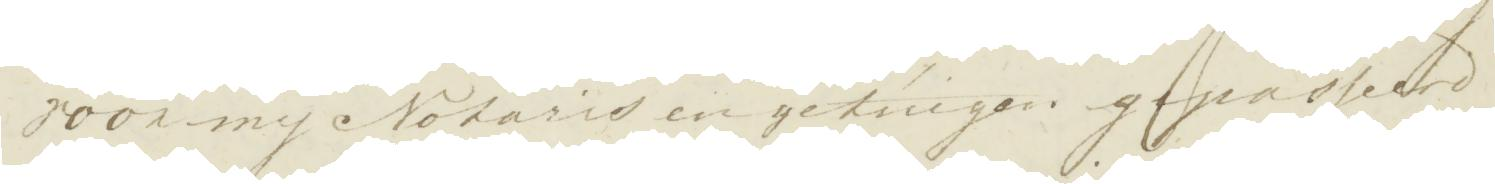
voor my Notaris en getuigen gepasseerd
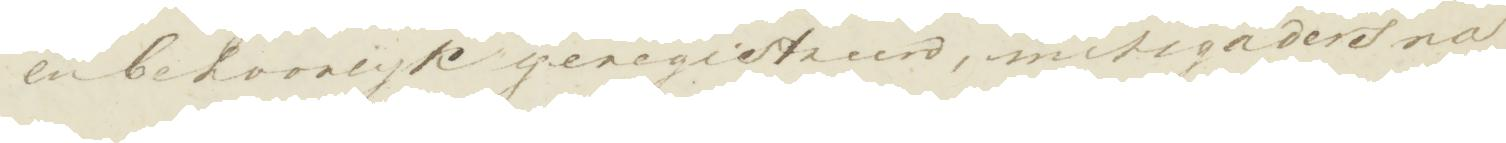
en behoorlijk geregistreerd, mitsgaders na
